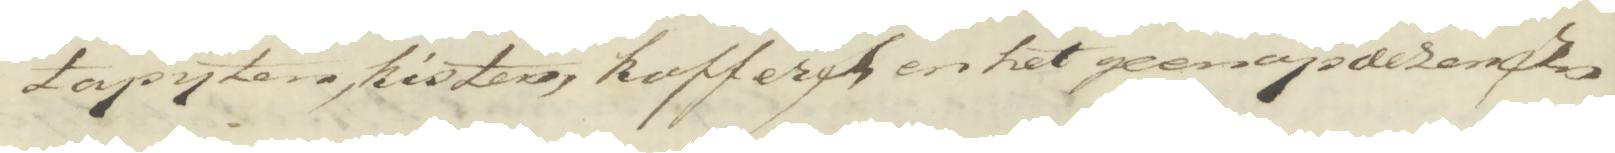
tapyten, kisten, koffers en het geen op dezen In
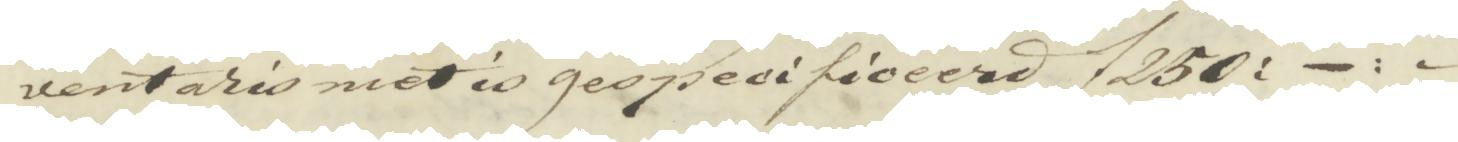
ventaris niet is gespecificeerd ƒ 250: —:
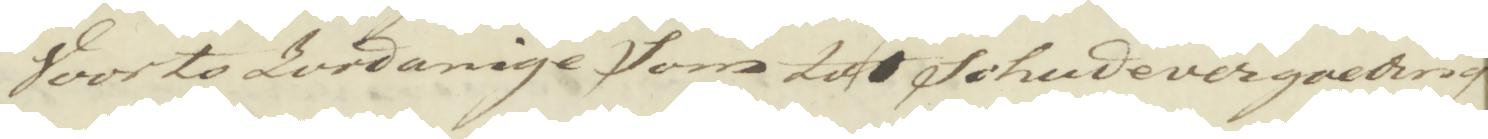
Voorts zoodanige Som tot Schadevergoeding
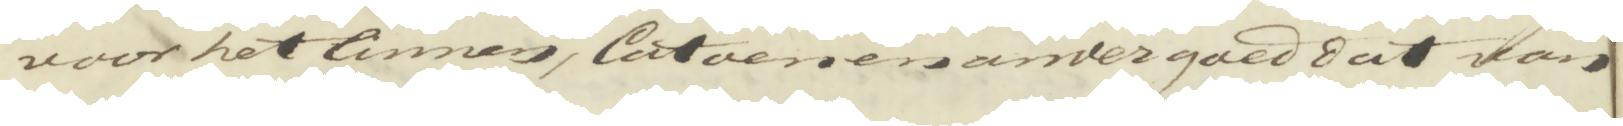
voor het linnen, Catoenen ander goed dat van
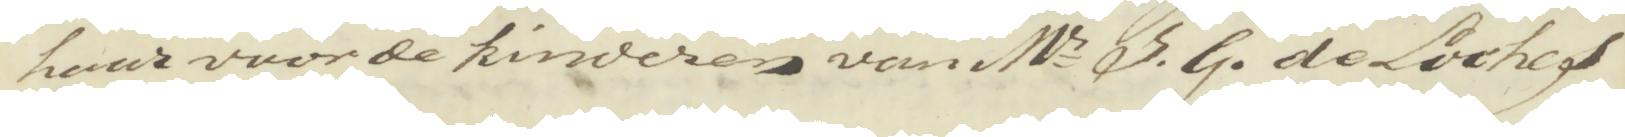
haar voor de kinderen van M=r J. G. den Loches
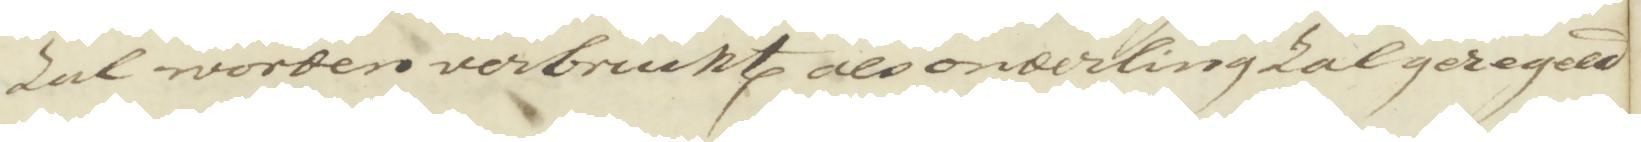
zal worden verbruikt als onderling zal geregeld
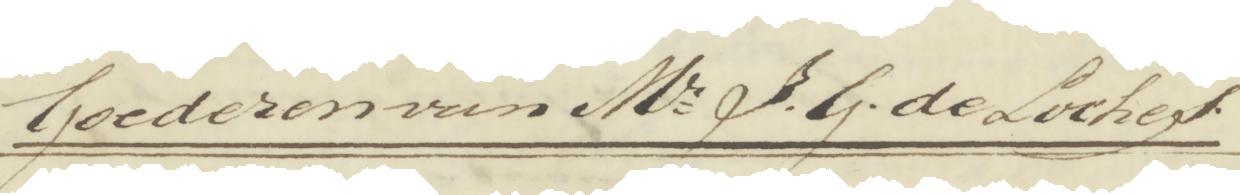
Goederen van M=r J. G. de Loches
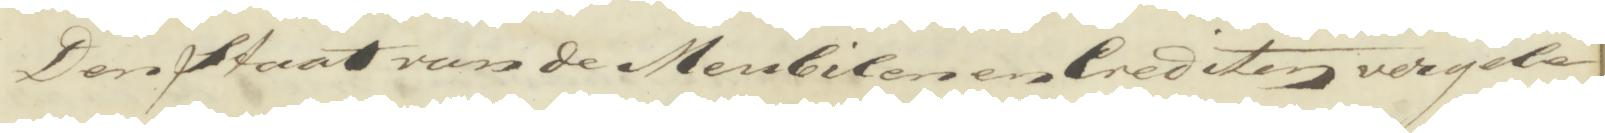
Den staat van de Meubilen en Crediten vergele
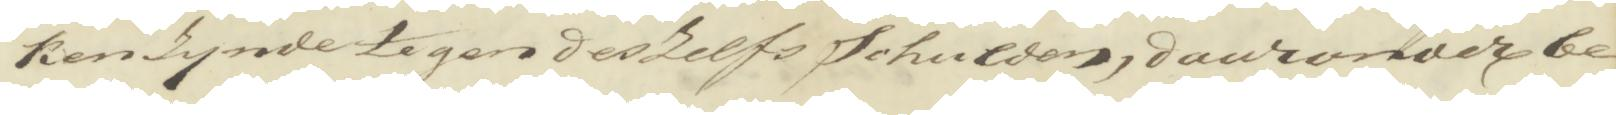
ken zynde tegen des zelfs schulden, daar onder be
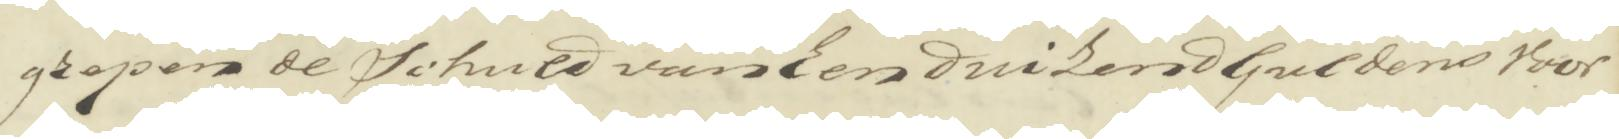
grepen de Schuld van Een duizend Guldens voor
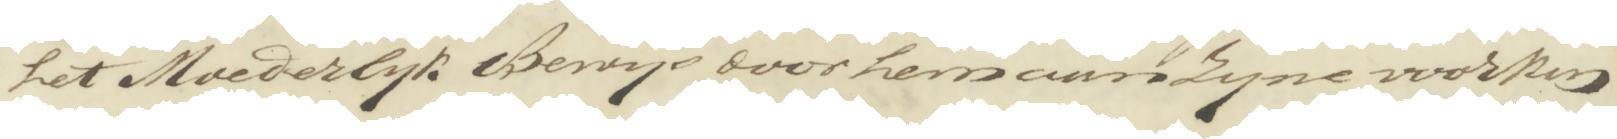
het Moederlyk Bewys door hem aan Zyne voorkin
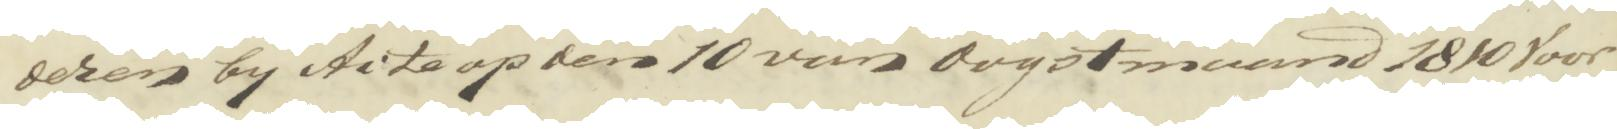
deren by Acte op den 10 van Oogstmaand 1810 voor
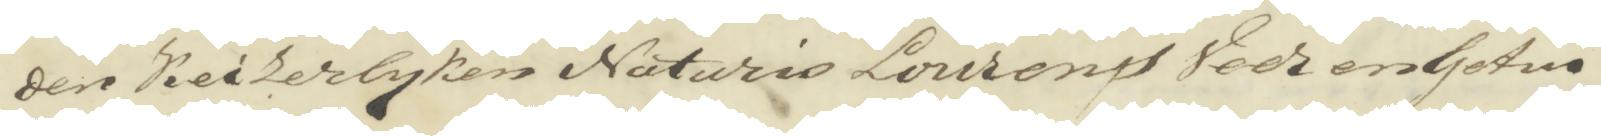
den Keizerlyken Notaris Lourens Veer en Getui
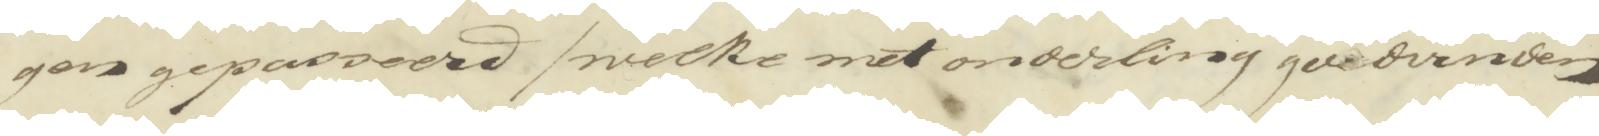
gen gepasseerd /welke met onderling goedvinden
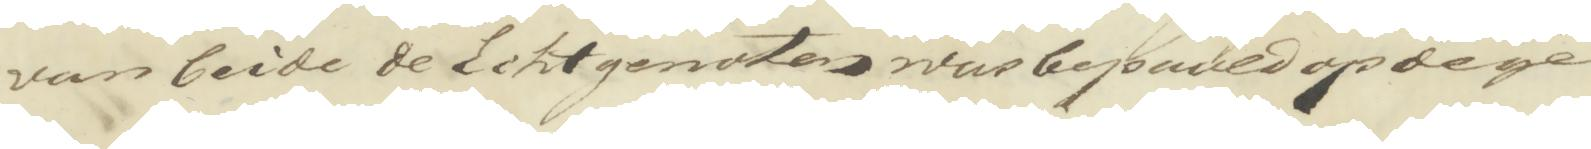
van beide de Echtgenoten was bepaald op de ge
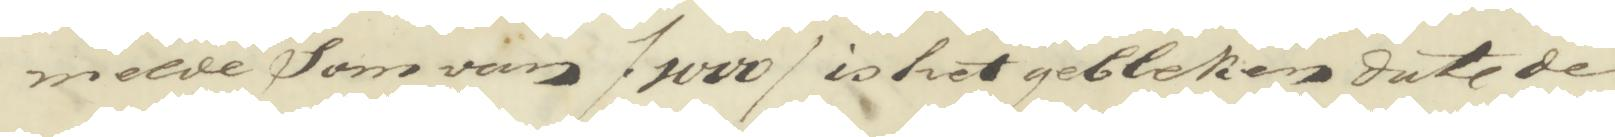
melde Som van ƒ 1000 / is het gebleken dat de
